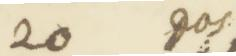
20 d:os
